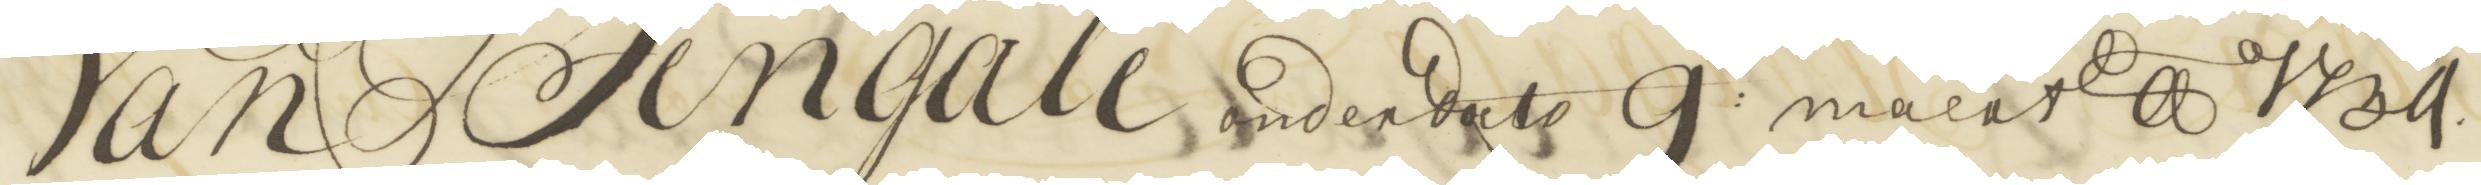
Van Bengale onder dato 9:' maert A:o 1734.
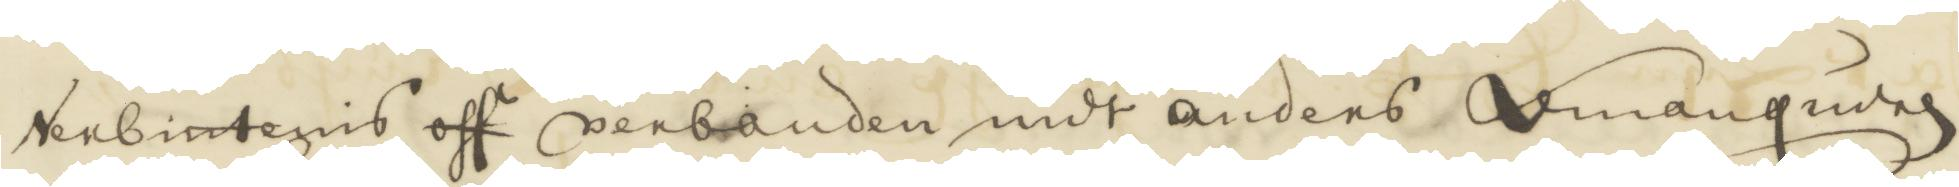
verbintenis off verbanden niet anders te manqueren
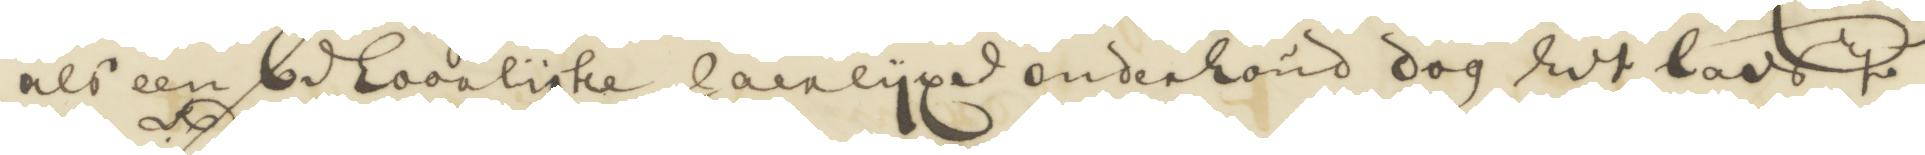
als een behoorlijke Jaerlijxe onderhoud dog het laeste
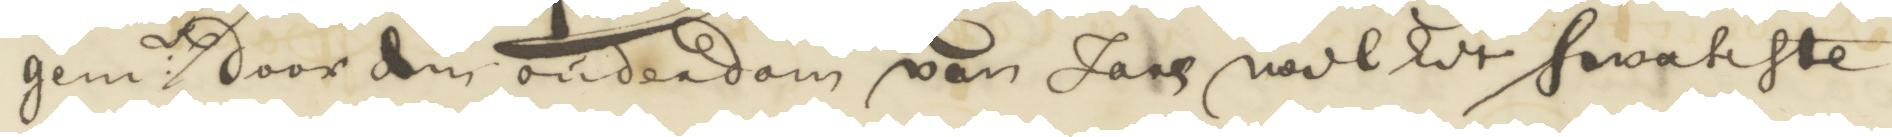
gem:e door den ouderdom van Jaren wel het Swakste
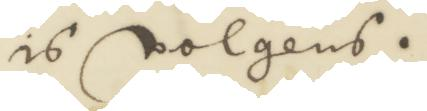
is volgens.
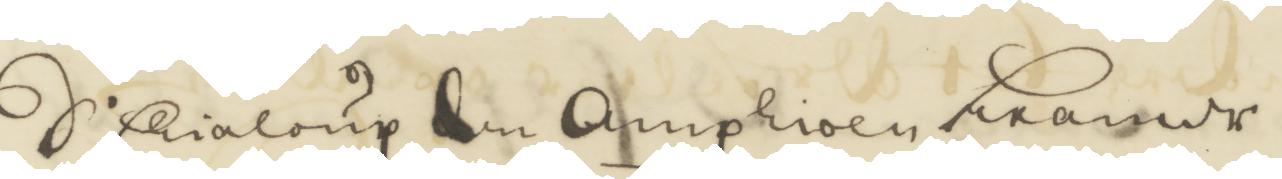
d'Chialoup den Amphioen Kramer
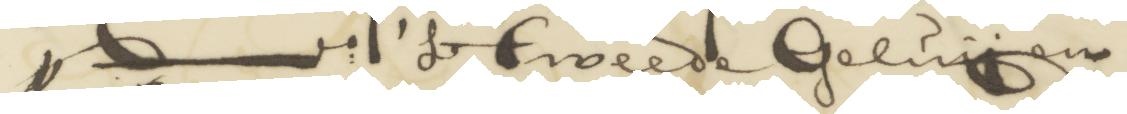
„ d:o 't tweede Geluijen
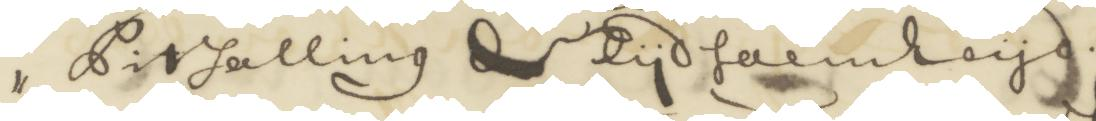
„ Pitjalling de lijdsaemheijd
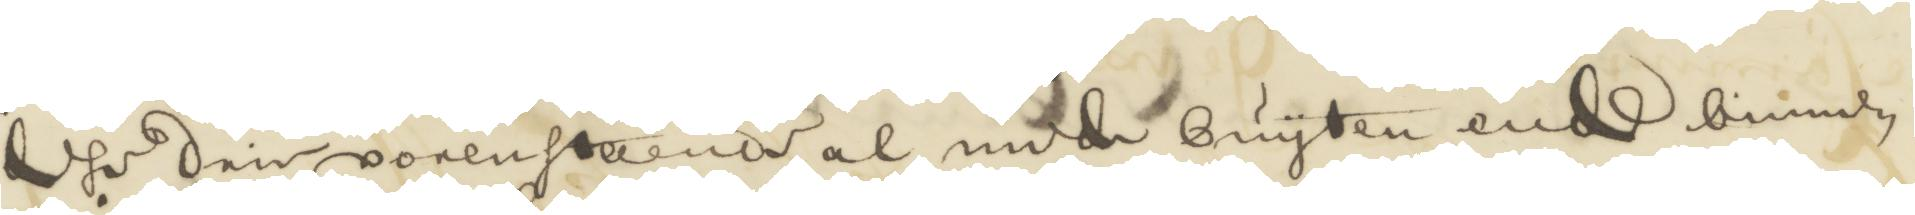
dese drie vorenstaende al mede buijten ende binnen
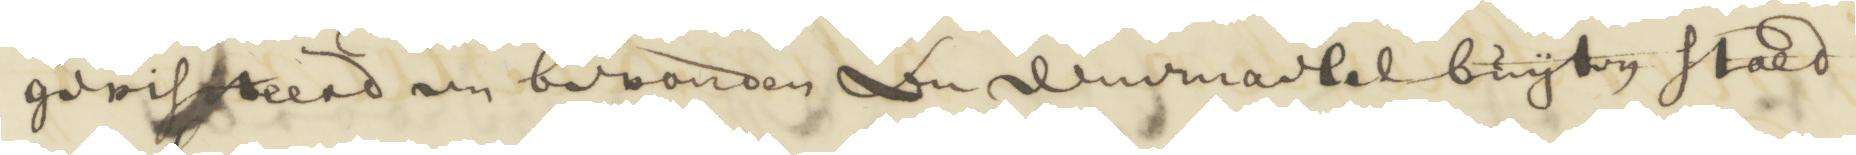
gevisiteerd en bevonden ten eene maele buijten Staed
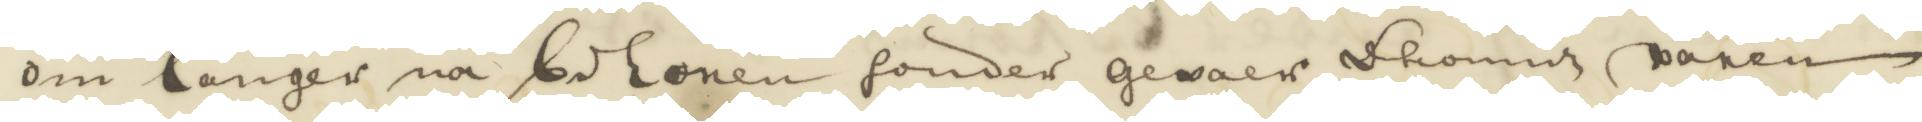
om langer na behoren sonder gevaer te konnen varen
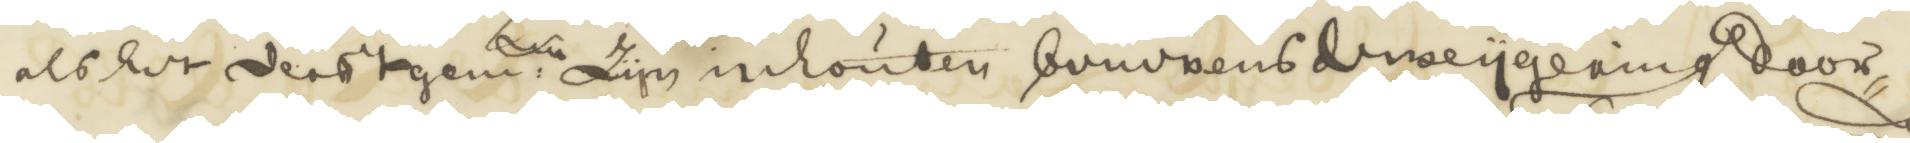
als het eerst gem:en Zijn inhouten benevens de weijgering door
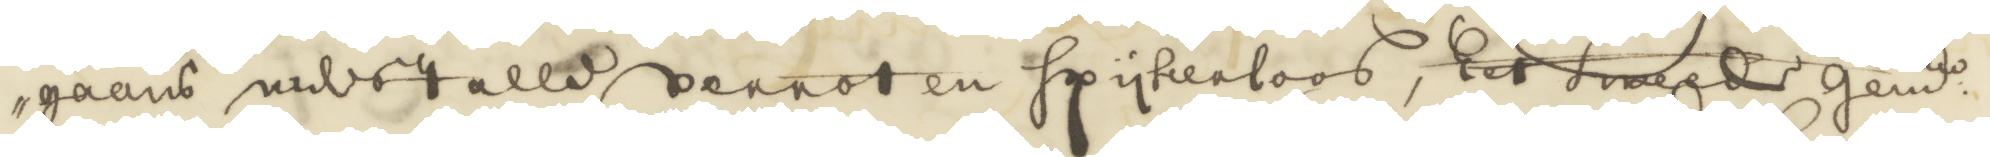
„gaans meest alle verrot en spijkerloos, het tweede gem:e
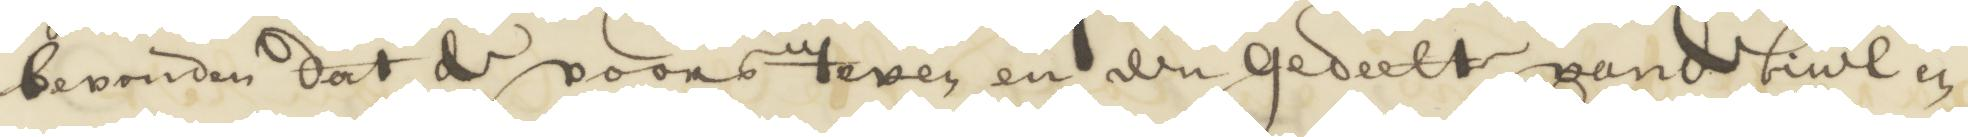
bevonden dat de voorsteven en een gedeelt van de kiel en
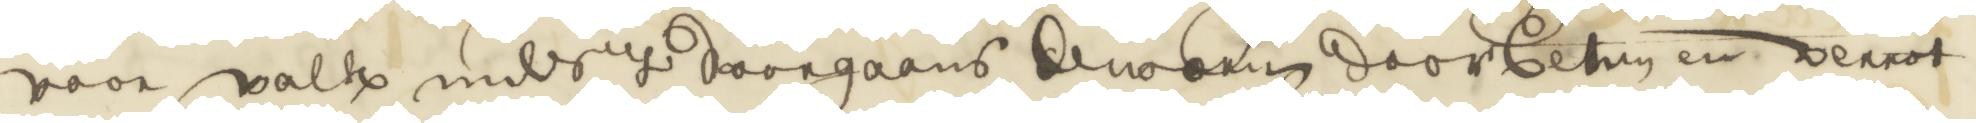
voor valk meest doorgaans de worm doorbeten en verrot
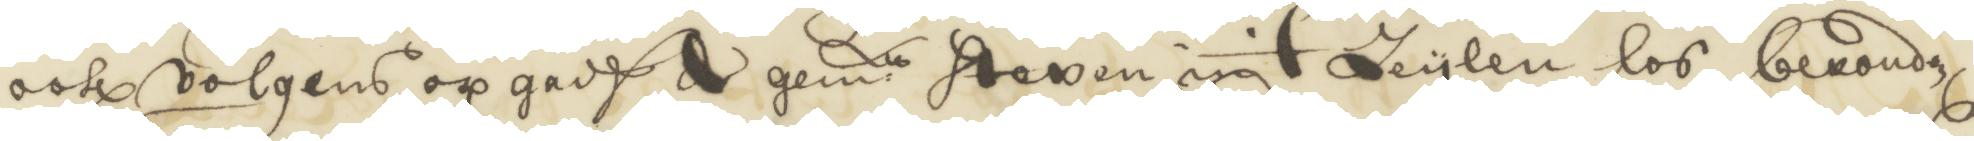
ook volgens opgaef de gem:e steven in 't Zeijlen los bevonden
